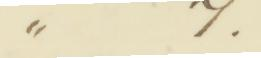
„ 7.
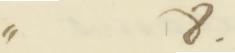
„ 8.
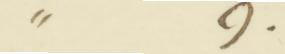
„ 9.
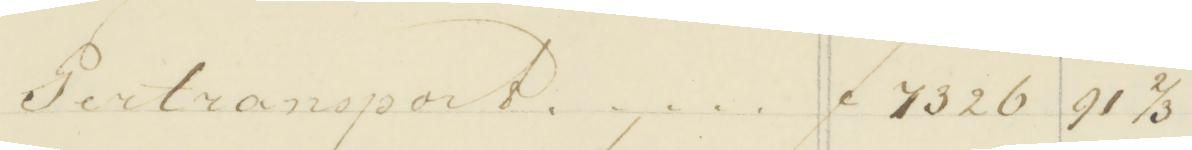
Per transport: . . . . . ƒ 7326 91 2/3
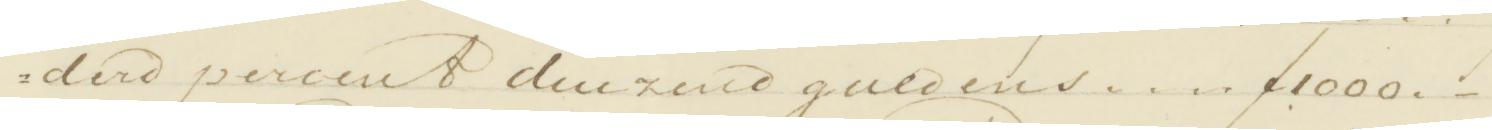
„derd percent duizend guldens . . . . ƒ1000. —
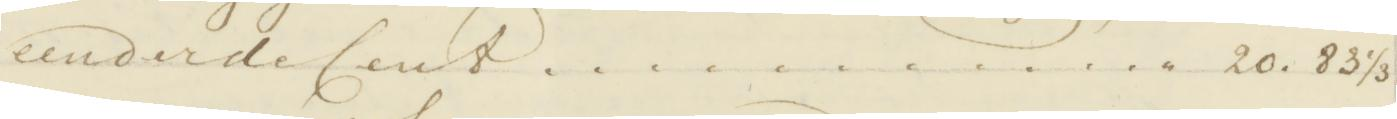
eenderde Cent . . . . . . . . . . . „ 20„ 83 1/3
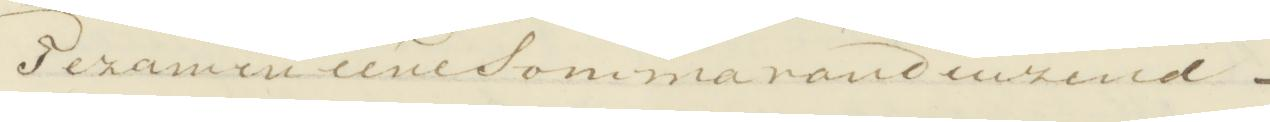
Tezamen eene somma vanduizend —
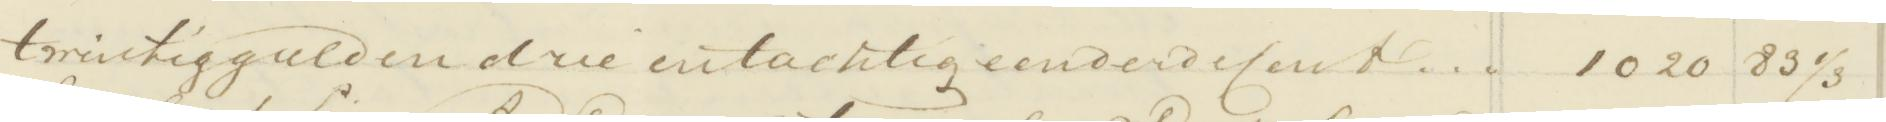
twintig gulden drie entachtig eenderde Cent . . „ 1020 83 1/3
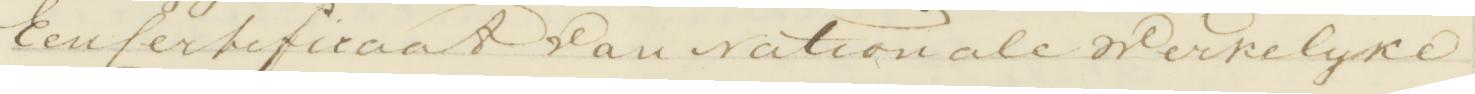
Een Certificaat Van Nationale Werkelyke
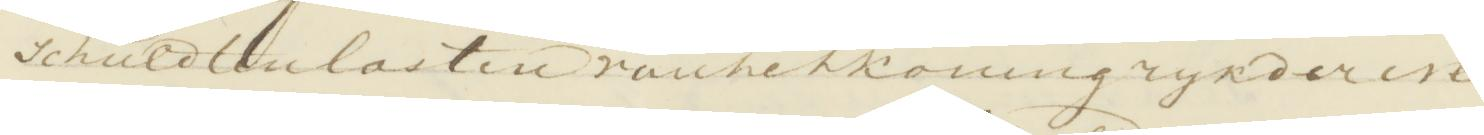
schuld ten lasten vanhetkoning rykder Ne
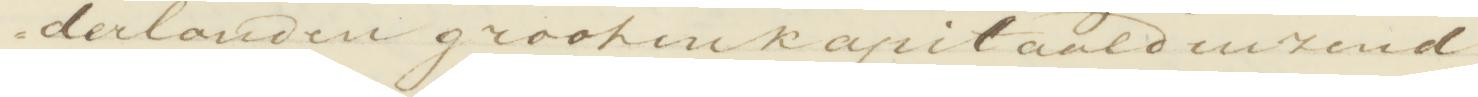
„derlanden groot in kapitaal duizend
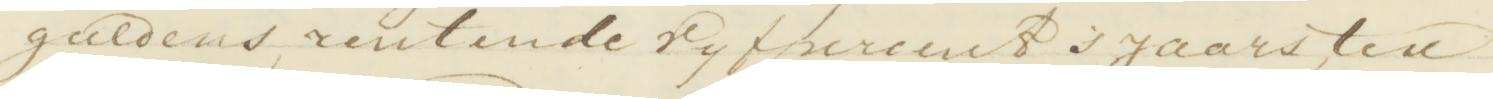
guldens, rentende Vyfpercent 's jaars ten
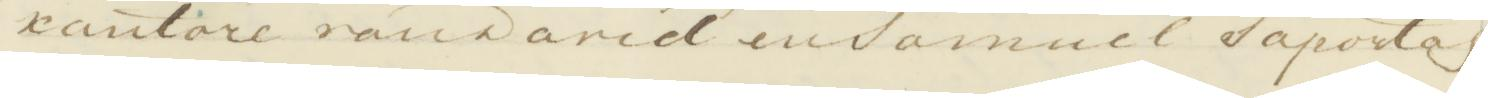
kantore van David en Samuel Saportas
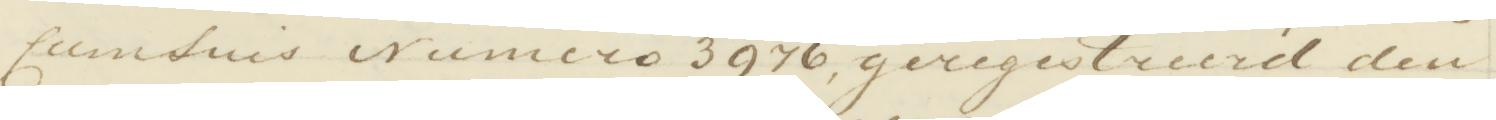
Cumsuis Numero 3976, geregistreerd den
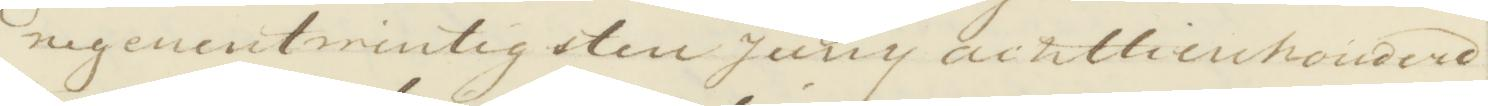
negenentwintigsten Juny achttienhonderd
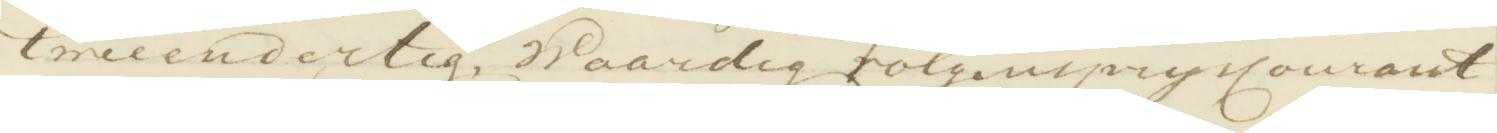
tweeendertig, Waardig volgens pryscourant
